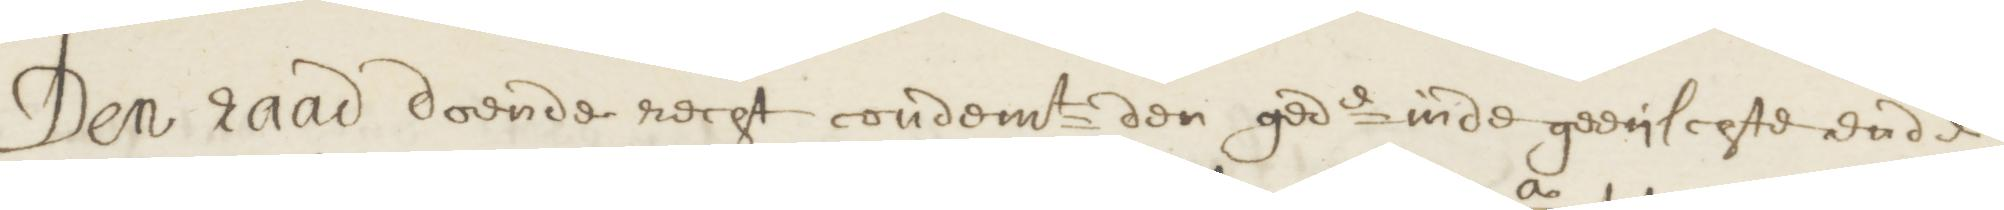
Den raad doende recht condem=t den ged=e inde geeijschte ende
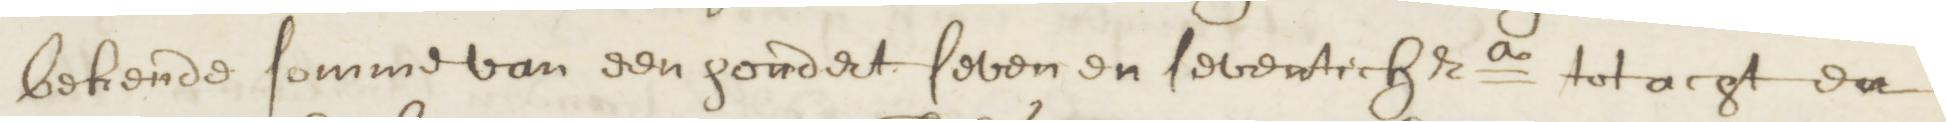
bekende somme van een hondert seven en seventich r=a tot acht en
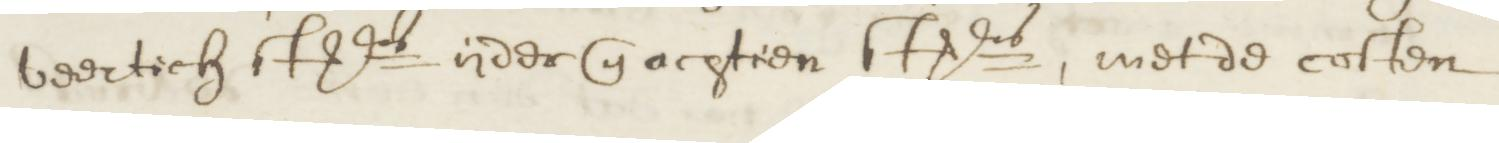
veertich stver=rs ijder ende achtien stver=rs, met de costen
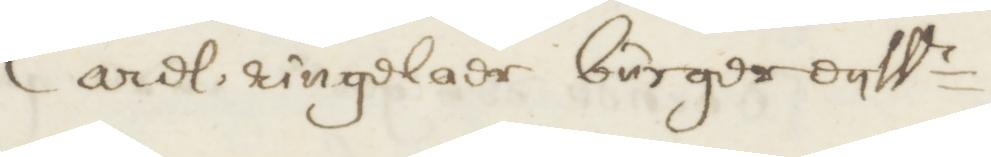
Carel ringelaer burger eijss=r
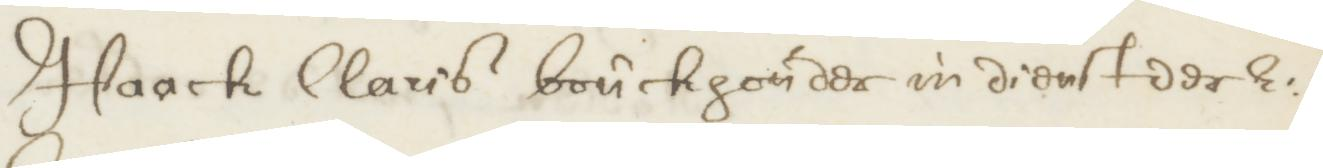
Jsaack Claus bouckhouder in dienstder E:
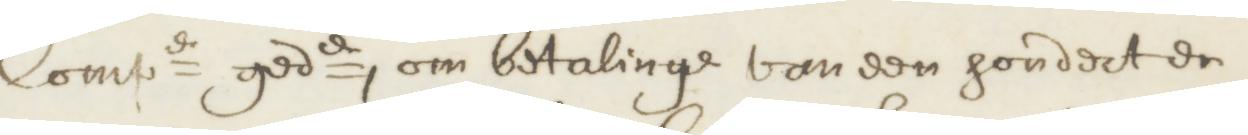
Comp=e ged=e, om betalinge van een hondert en
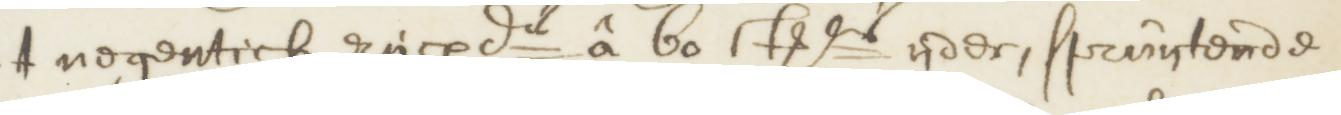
t negentich rijcxd=s â 60 stver=rs ijder, spruijtende
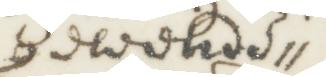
geleende„
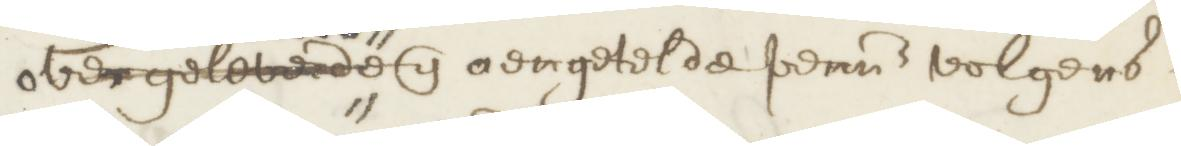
overgeleverde ende aengetelde penn volgens —
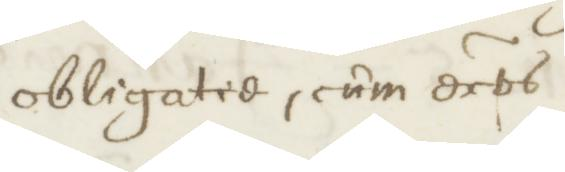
obligatie, cum exps
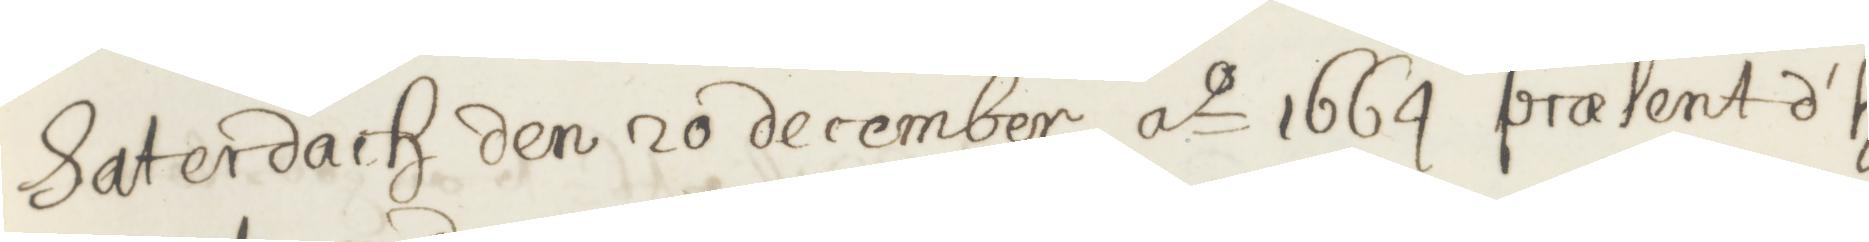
Saterdach den 20 december a=o 1664 praesent d’ H=ren Commissarissen
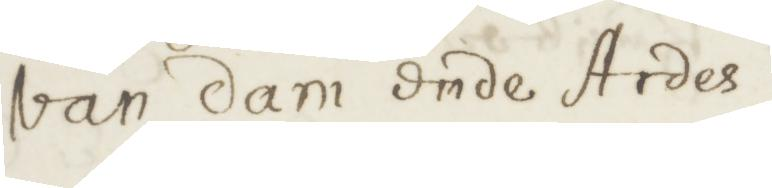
Van dam ende Ardes
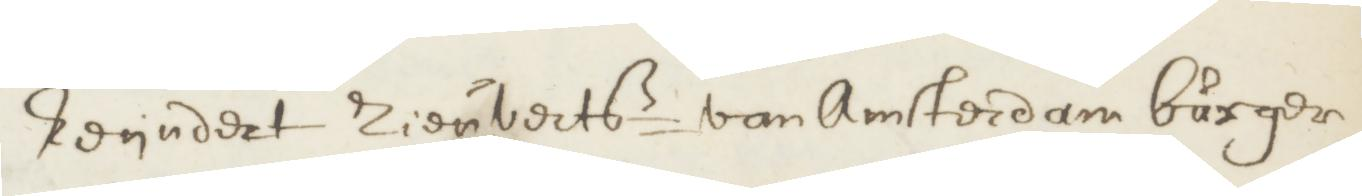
Reijndert zieuverts= van Amsterdam burger
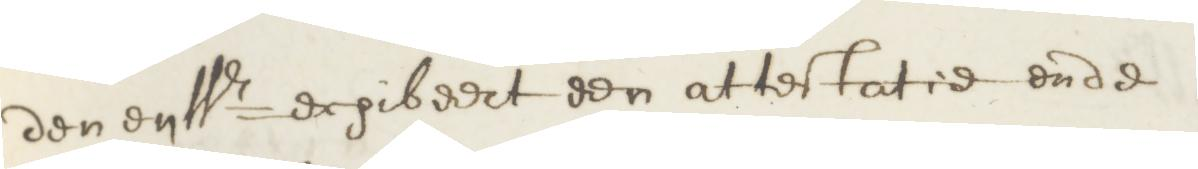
den eyss=r exhibeert een attestatie ende
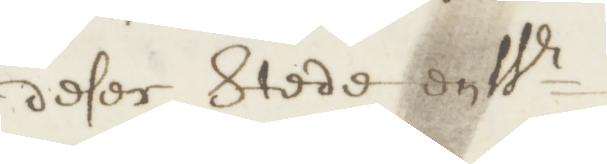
deser Stede Eyss=r
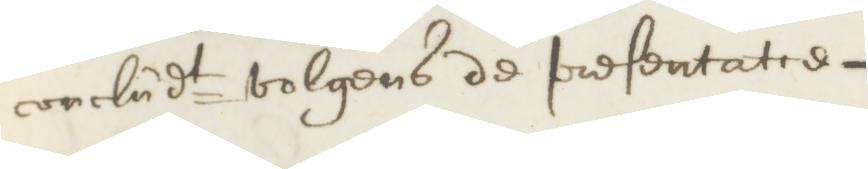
conclud=t volgens de presentatie —
